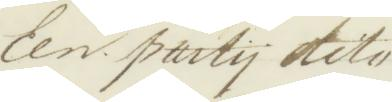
Een partij dito
